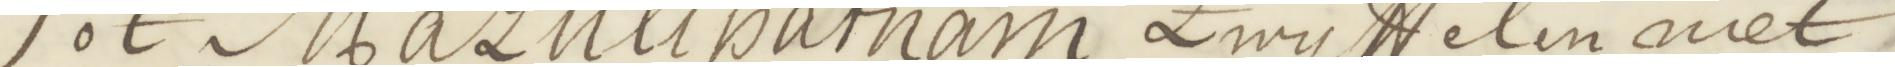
Tot Mazulipatnam twyffelen niet
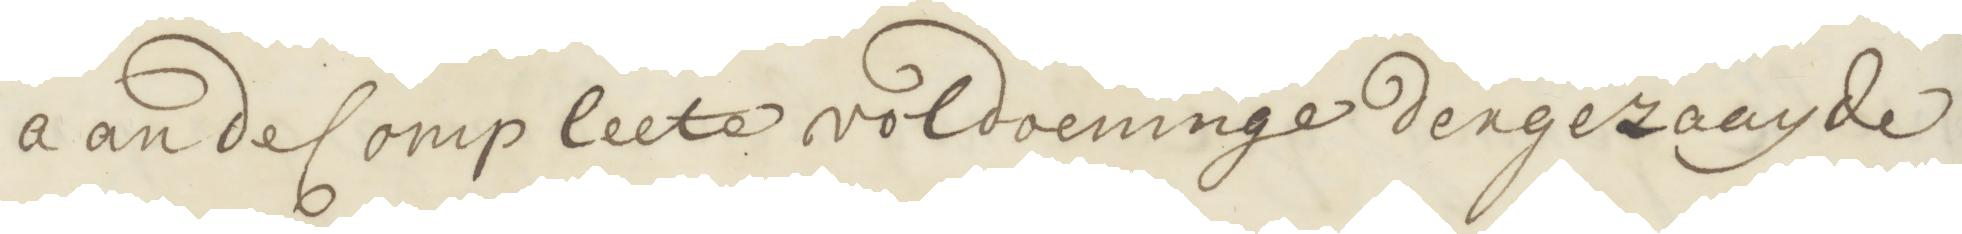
aan de Compleete voldoeninge dergezaayde
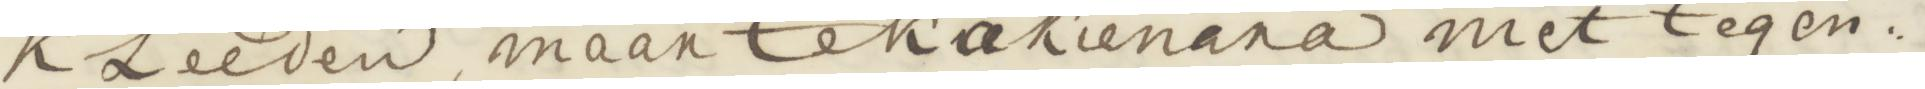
kleeden, maar te kakienara niet tegen:
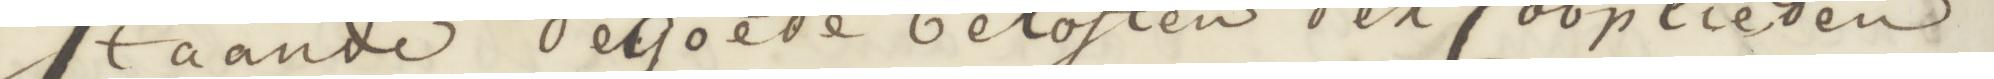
staande degoede beloften der Cooplieden
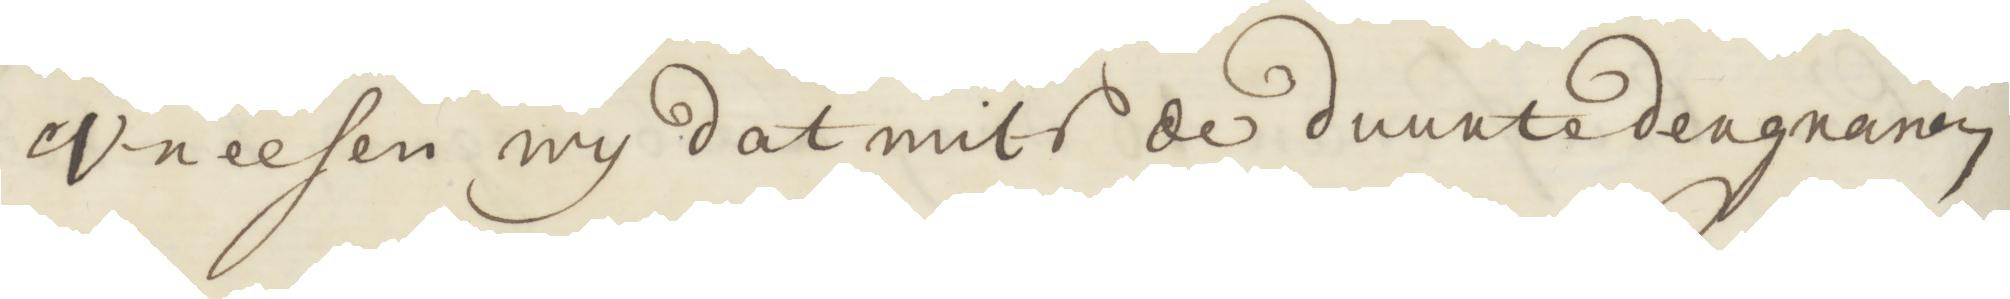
vreesen wij dat mits de duurte der granen
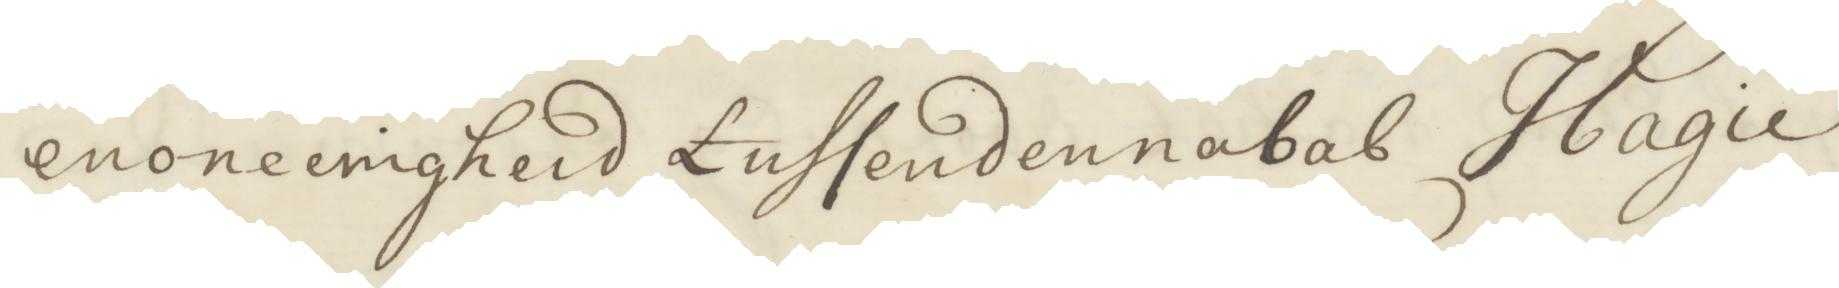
enoneenigheid tussen den nabab Hagie
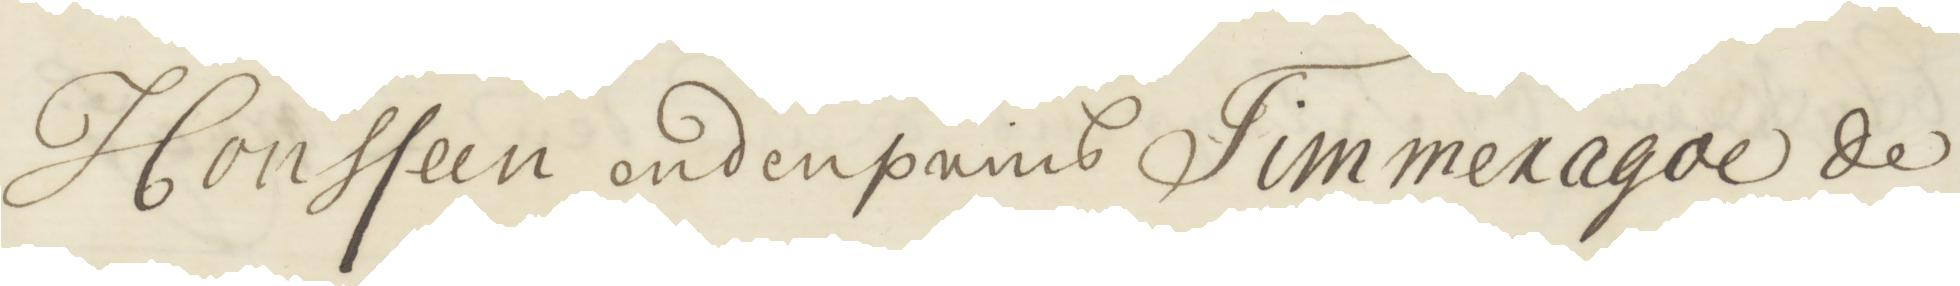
Housseen onderprins Timmeragoe de
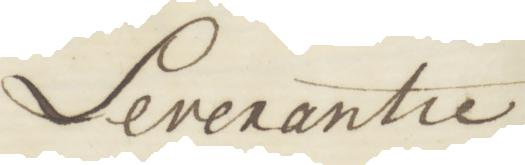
Leverantie
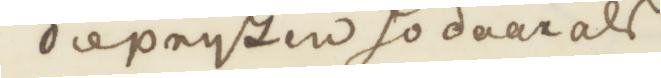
die pryzen so daar als
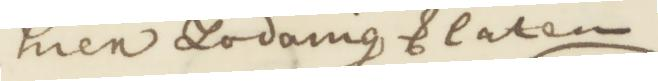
hier zodanig verlaten
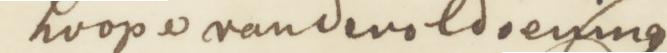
hoope van de voldoening
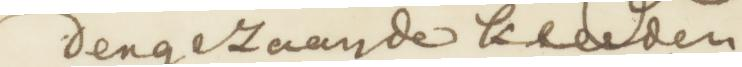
dergezaayde kleeden
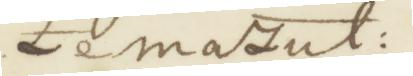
te mazul:
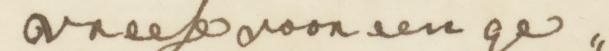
vreese voor een ge„
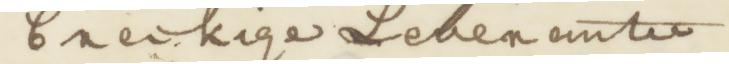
breckige Leverantie
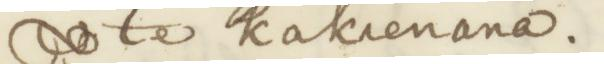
en te kakienana.
